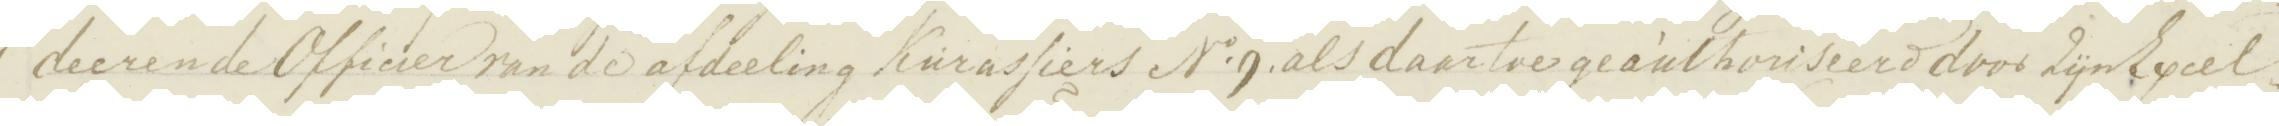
deerende Officier van de afdeeling Kurassiers N.o 9. als daartoe geauthoriseerd door zijn Excel
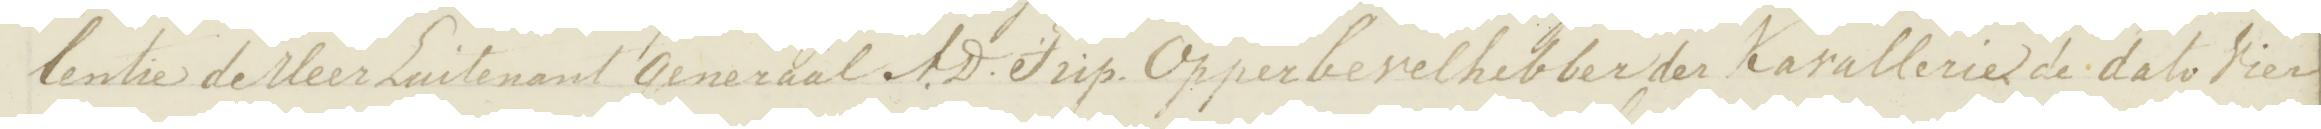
lentie de Heer Luitenant generaal A.D. Trip. Opperbevelhebber der Kavallerie de dato Vier
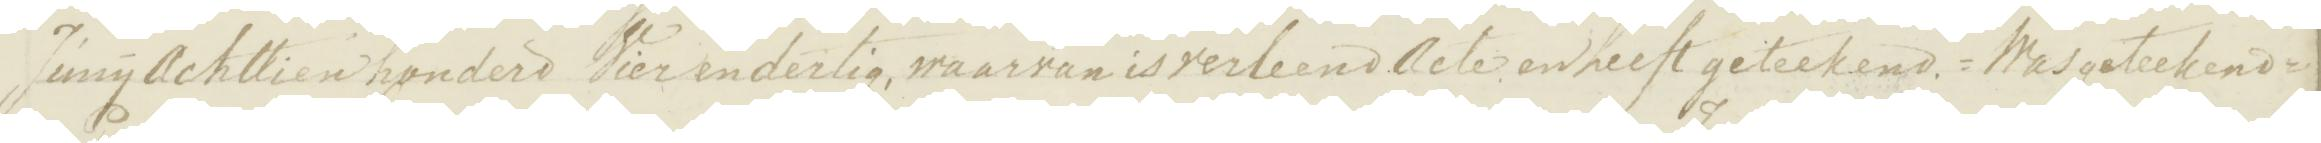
Junij Achttien honderd Vier en dertig, waarvan is verleend Acte en heeft geteekend. = Was geteekend =
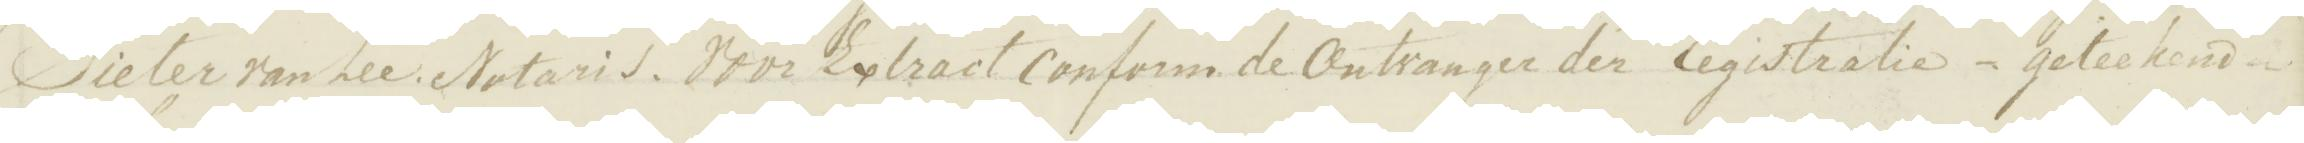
Pieter van Lée. Notaris. Voor Extract conform de Ontvanger der registratie = geteekend =
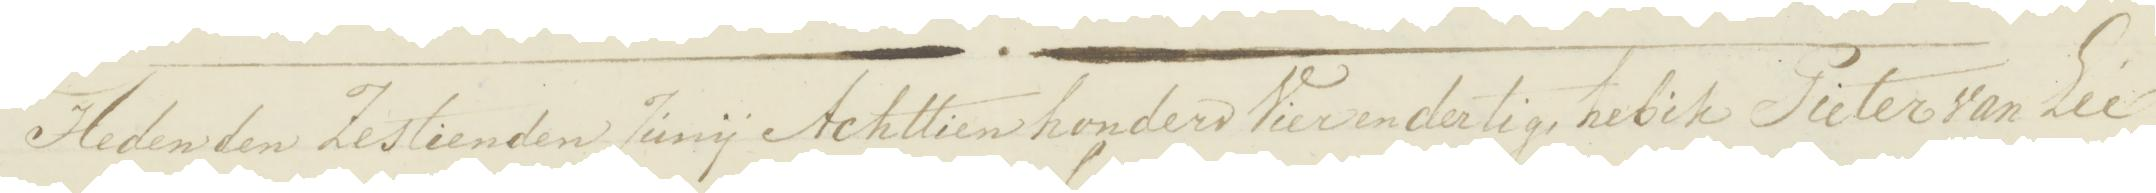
Heden den Zestienden Junij Achttien honderd Vier en dertig, heb ik Pieter van Leé,
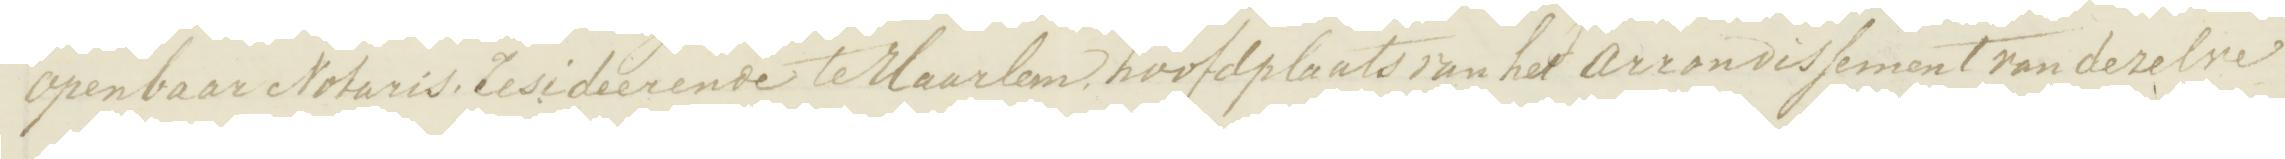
openbaar Notaris, resideerende te Haarlem, hoofdplaats van het Arrondissement van dezelve
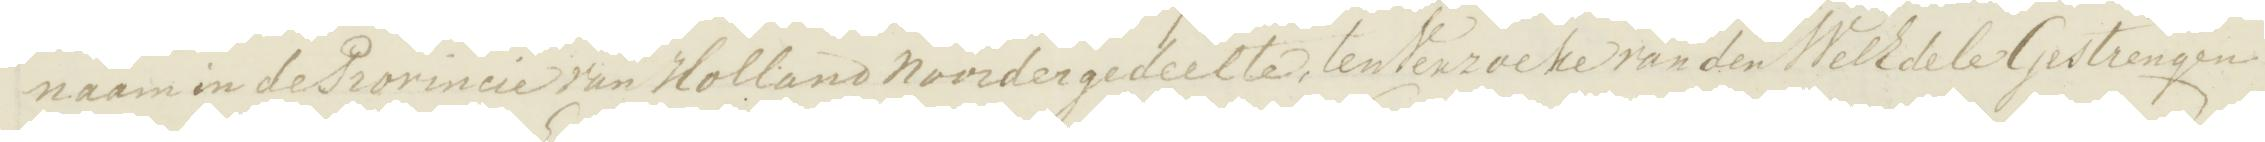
naam in de Provincie van Holland Noordergedeelte, ten Verzoeke van den WelEdele Gestrengen
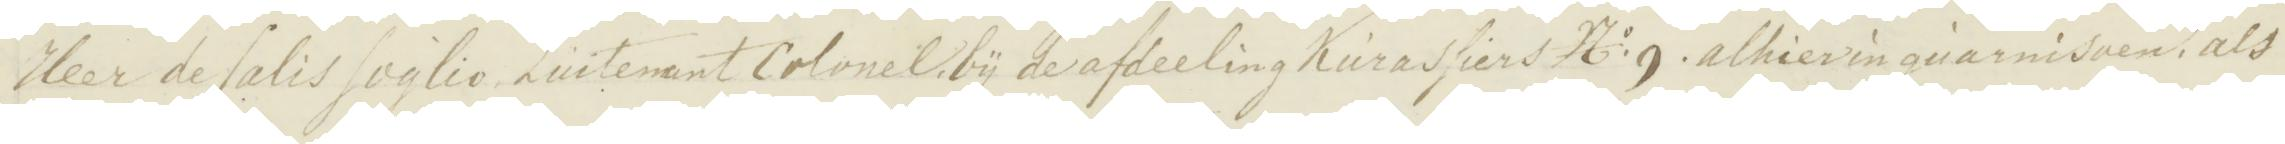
Heer de Salis Soglio, Luitenant Colonel, bij de afdeeling Kurassiers N.o 9. alhier in guarnisoen, als
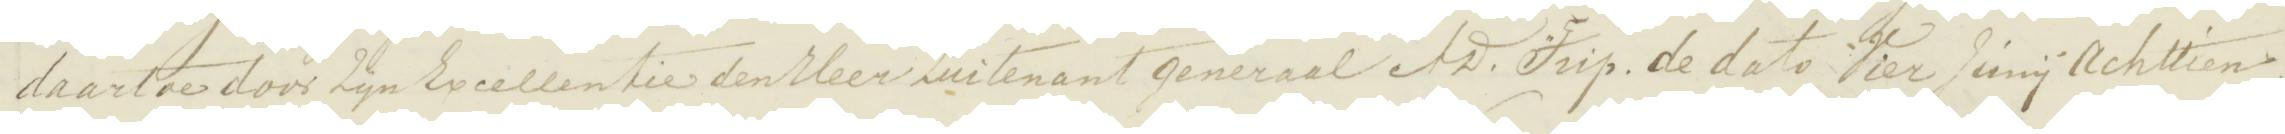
daartoe door zijn Excellentie den Heer Luitenant generaal AD. Trip. de dato Vier Junij Achttien
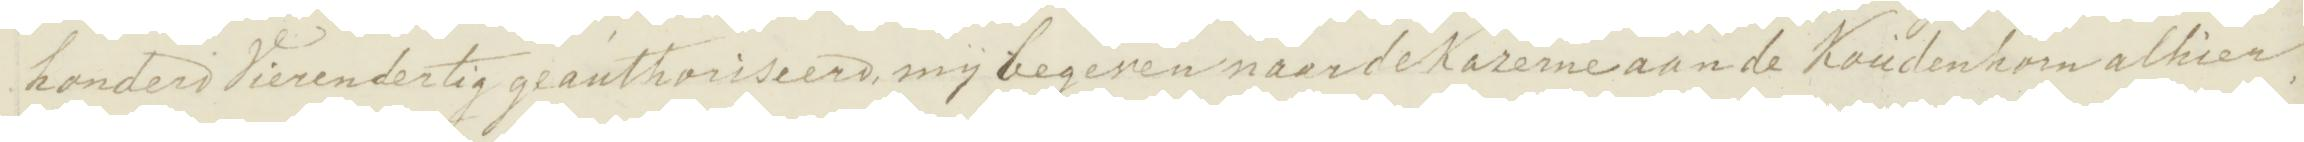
honderd Vier en dertig geauthoriseerd, mij begeven naar de Kazerne aan de Koudenhorn alhier,
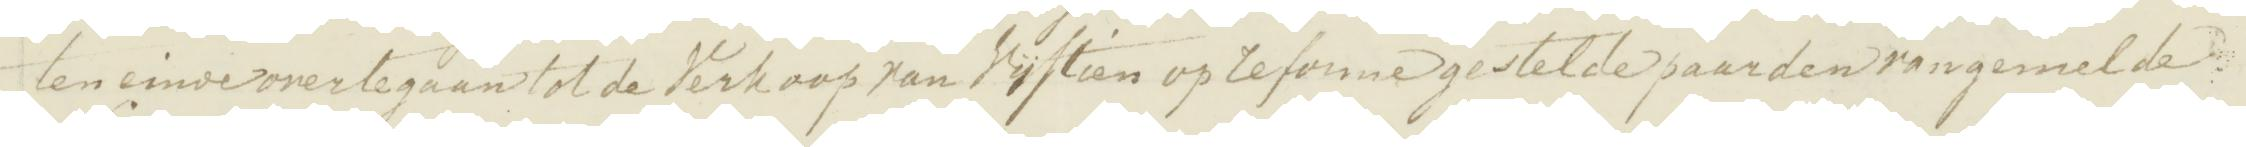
ten einde over tegaan tot de Verkoop van Vijftien op reforme gestelde paarden van gemelde
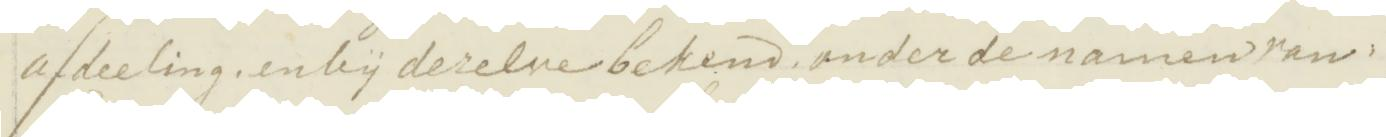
afdeeling, en bij dezelve bekend, onder de namen van:
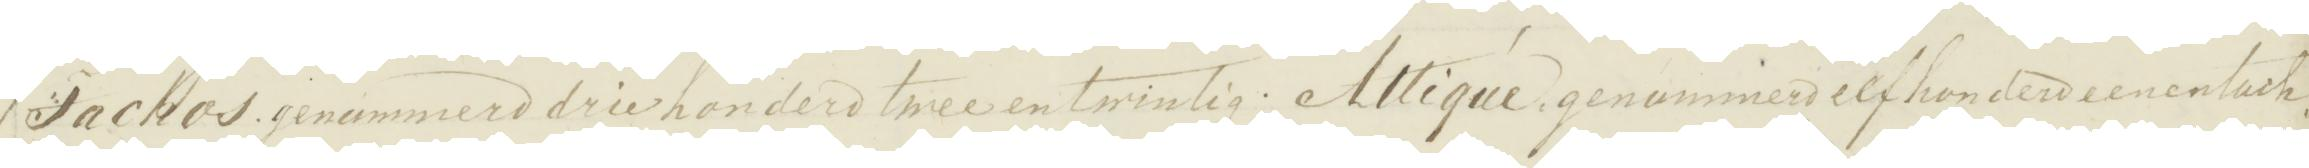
Jachos. genummerd drie honderd twee en twintig. Attique, genummerd elf honderd een en tacht„
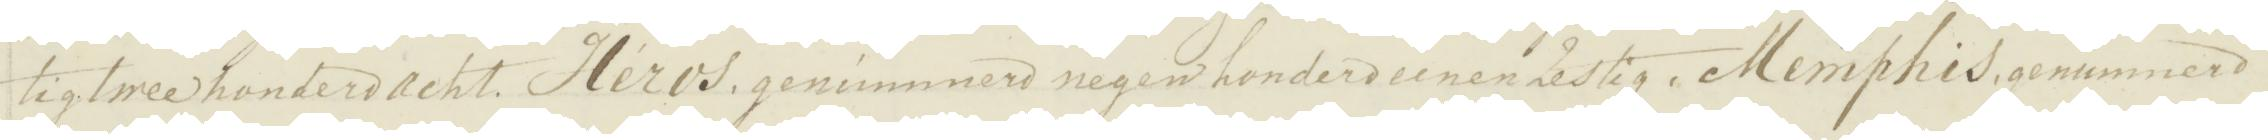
tig twee honderd acht. Heros, genummerd negen honderd eenen zestig, Memphis, genummerd
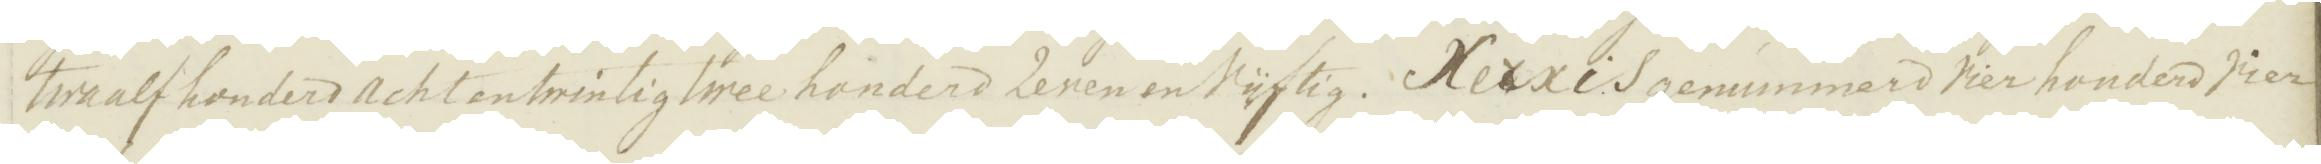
twaalf honderd acht en twintig twee honderd zeven en vijftig. Xerxis genummerd vier honderd vier
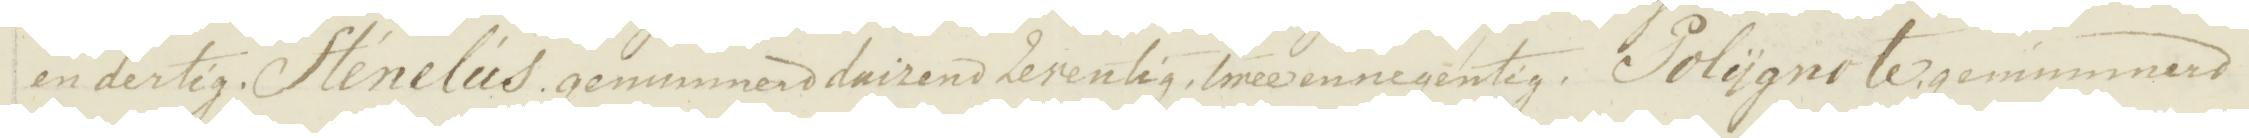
en dertig. Sténelus, genummerd duizend zeventig, twee en negentig. Polijgnote, genummerd
